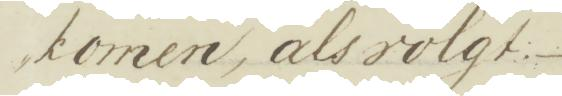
„komen, als volgt:
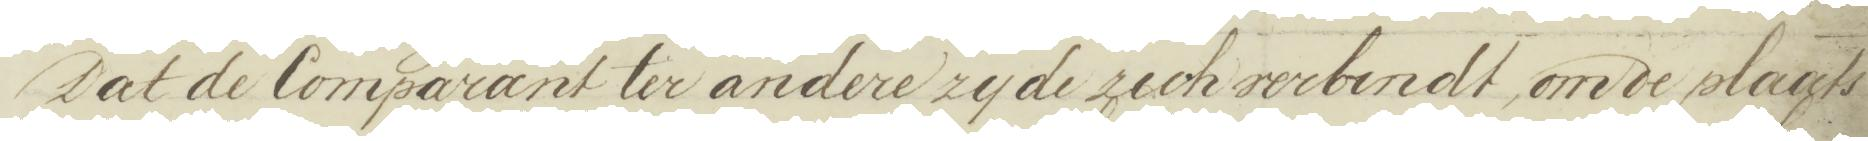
Dat de Comparant ter andere zyde zich verbindt, om de plaats
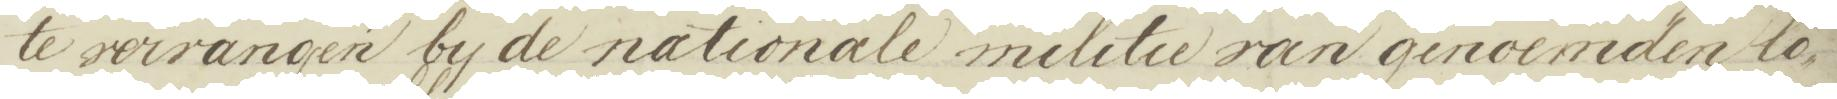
te vervangen by de nationale militie van genoemden lo„
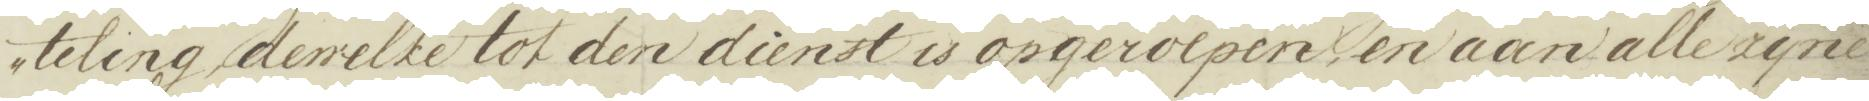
„teling, dewelke tot den dienst is opgeroepen, en aan alle zyne
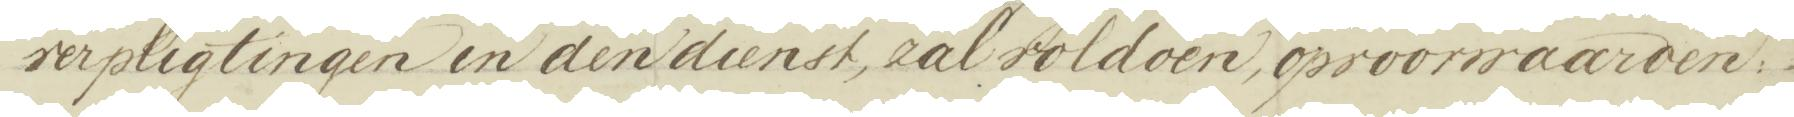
verpligtingen in den dienst, zal voldoen, opvoorwaarden:
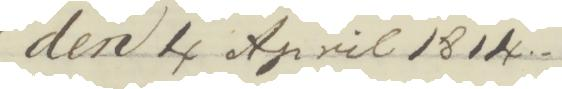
den 4 April 1814. -
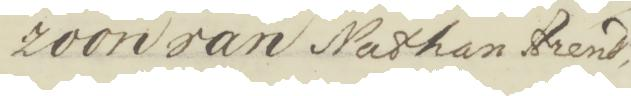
zoon van Nathan Arends
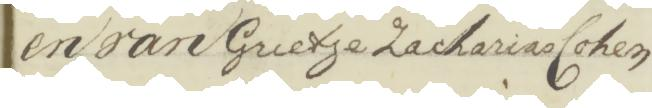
en van Grietje Zacharias Cohen
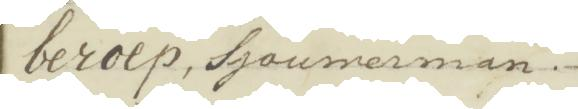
beroep, sjouwerman.
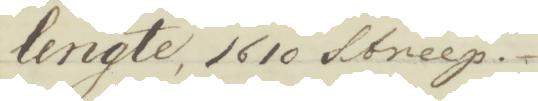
lengte, 1610 streep.
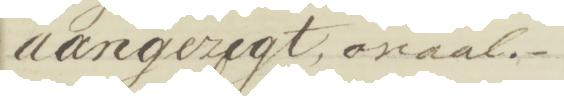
aangezigt, ovaal. -
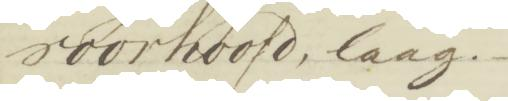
voorhoofd, laag.
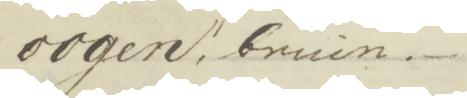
oogen, bruin. –
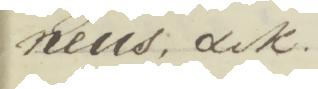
neus, dik
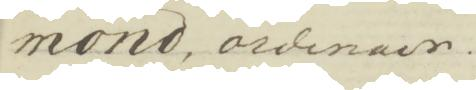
mond, ordinair
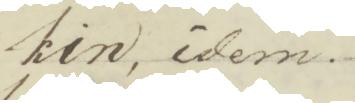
kin, idem.
